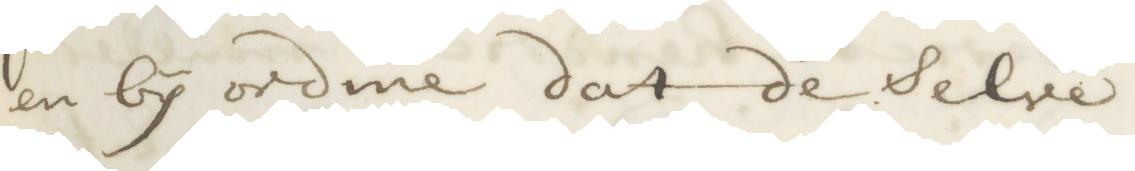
en bij ordine dat de selve
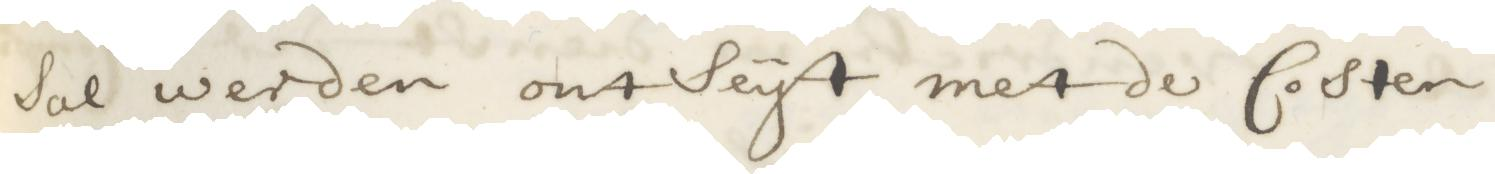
sal werden ontseijt met de Costen
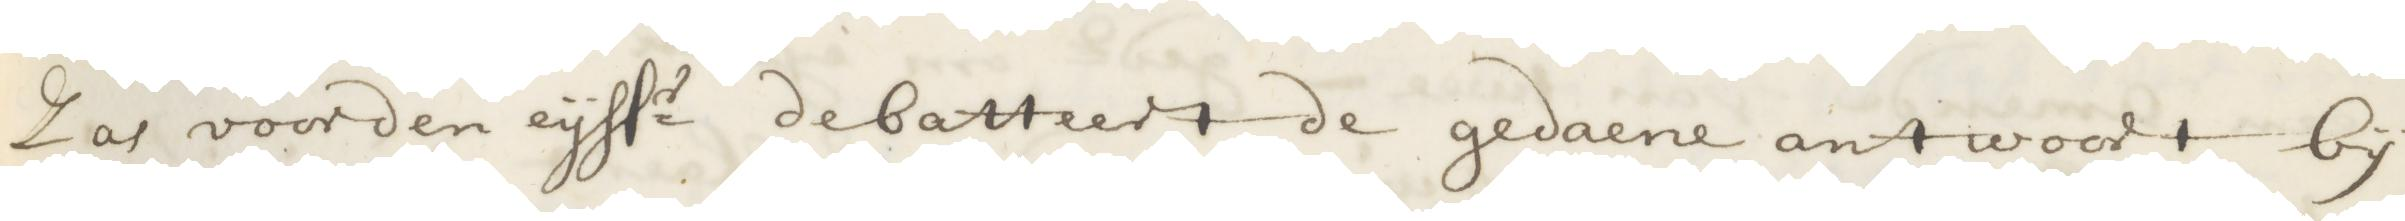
Zas voor den eijss=r debatteert de gedaene antwoort bij
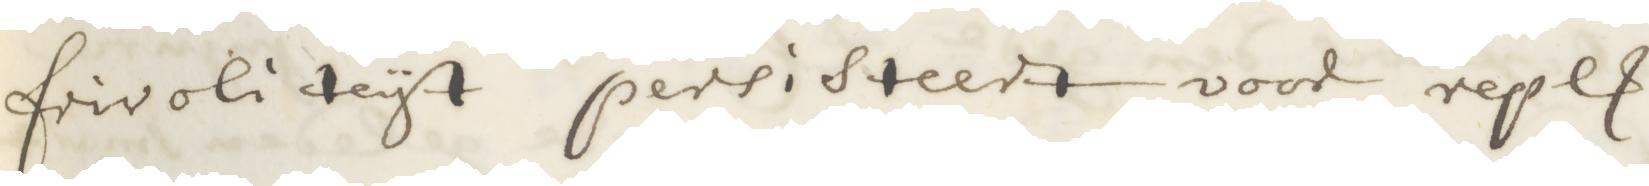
frivoliteijt persisteert voor repl
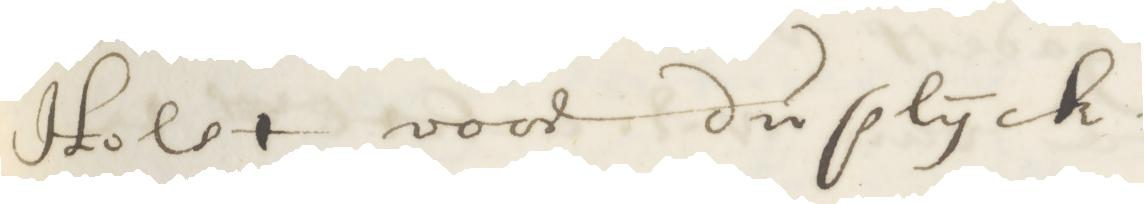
Holst voor duplijck
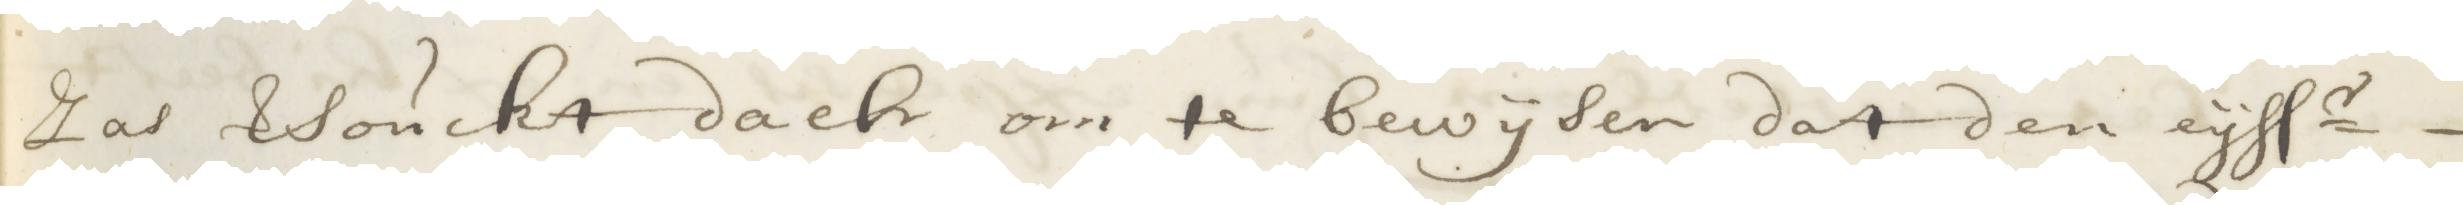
Zas versouckt dach om te bewijsen dat den eijss=r —
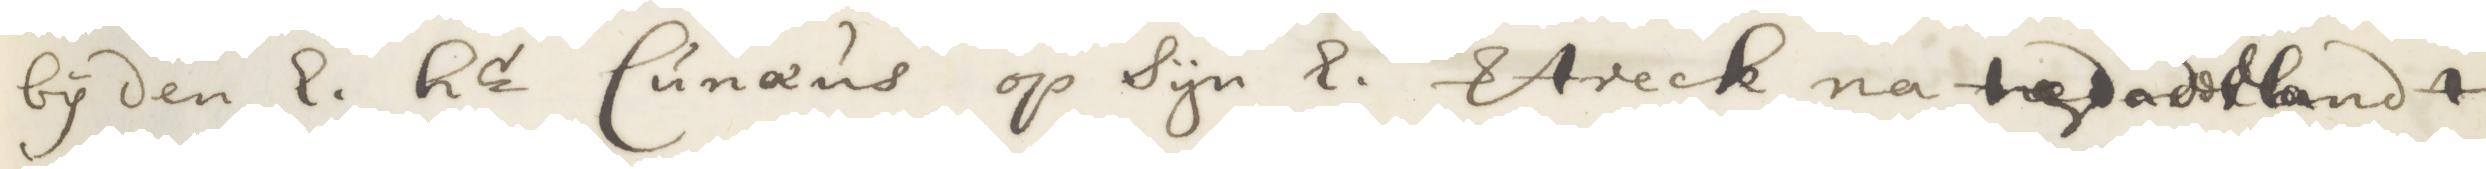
bij den E. h=r Cunaus op sijn E. vertreck na t Vaderlandt
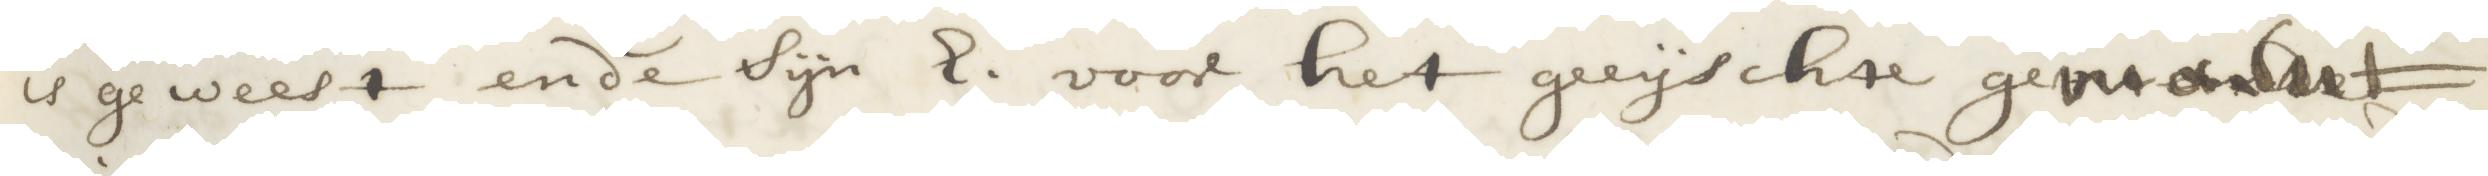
is geweest ende sijn E. voor het geeijschte gemaent
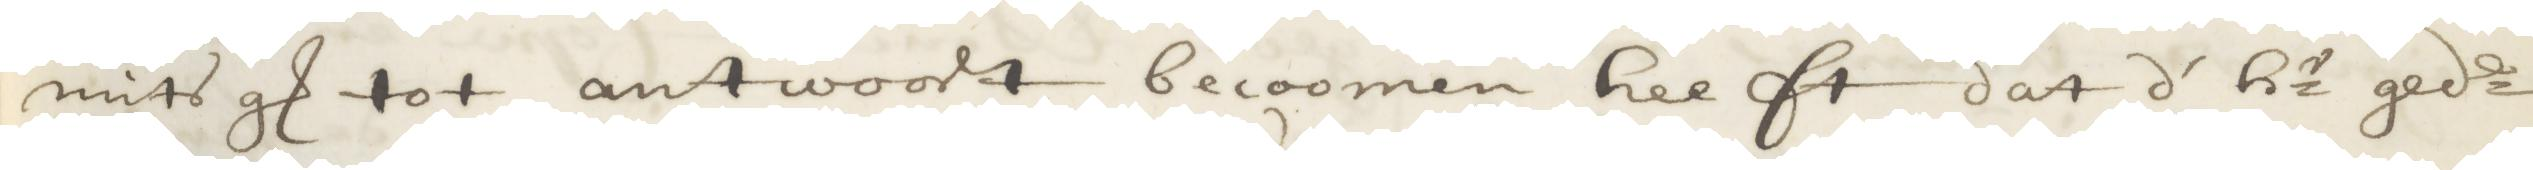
mitsg tot antwoort becoomen heeft dat d’ h=r ged=e
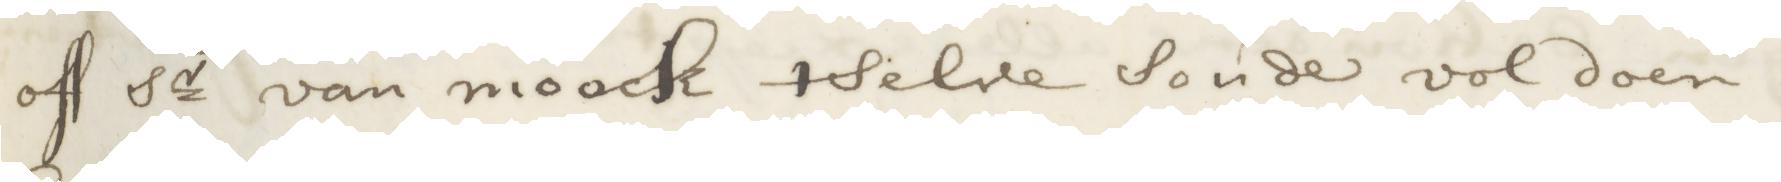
off s=r van moock t selve soude voldoen
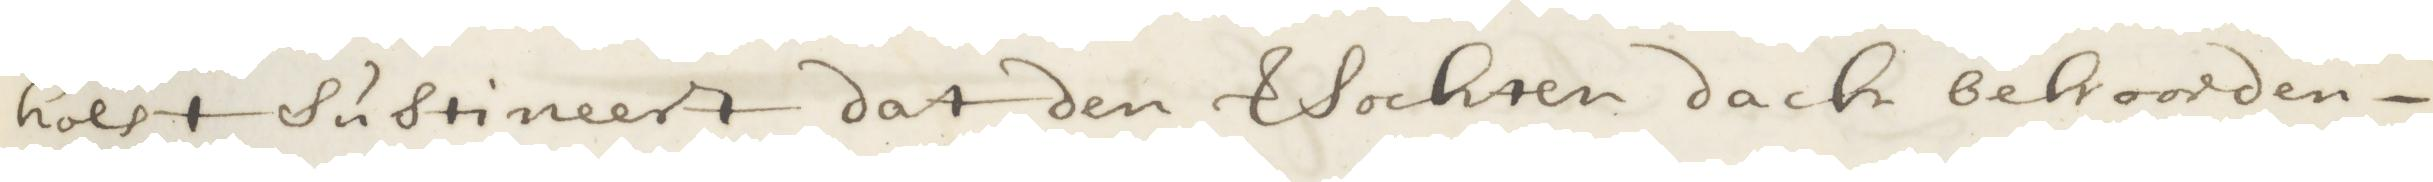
holst sustineert dat den versochten dach behoorden —
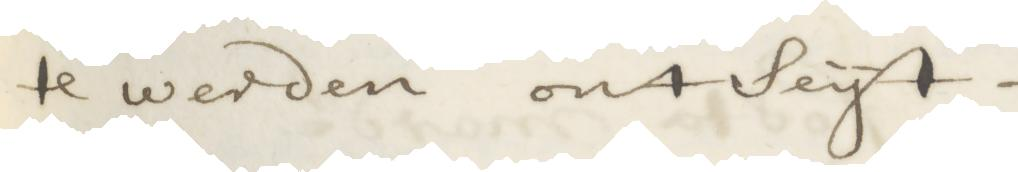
te werden ontseijt
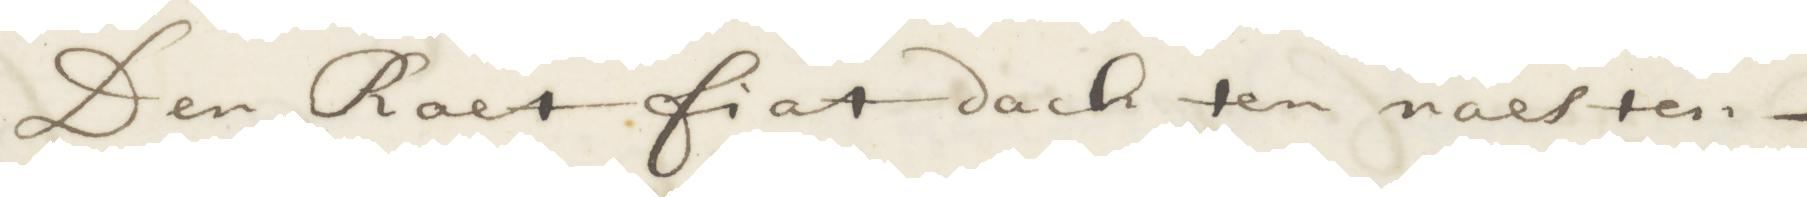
Den Raet fiat dach ten naesten
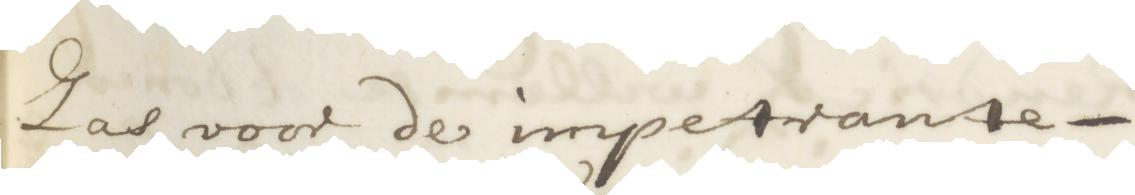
Zas voor de impetrante
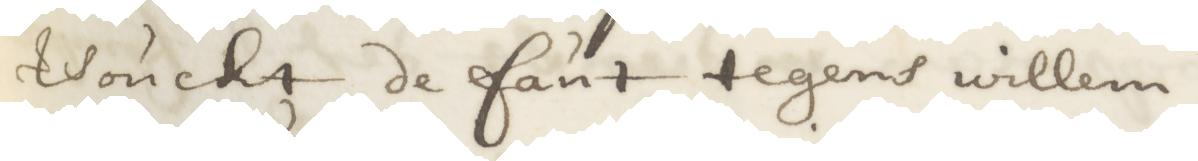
versouckt defaut tegens willem
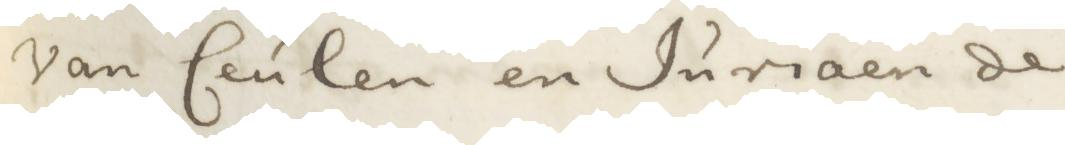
van Ceulen en Iuriaen de
